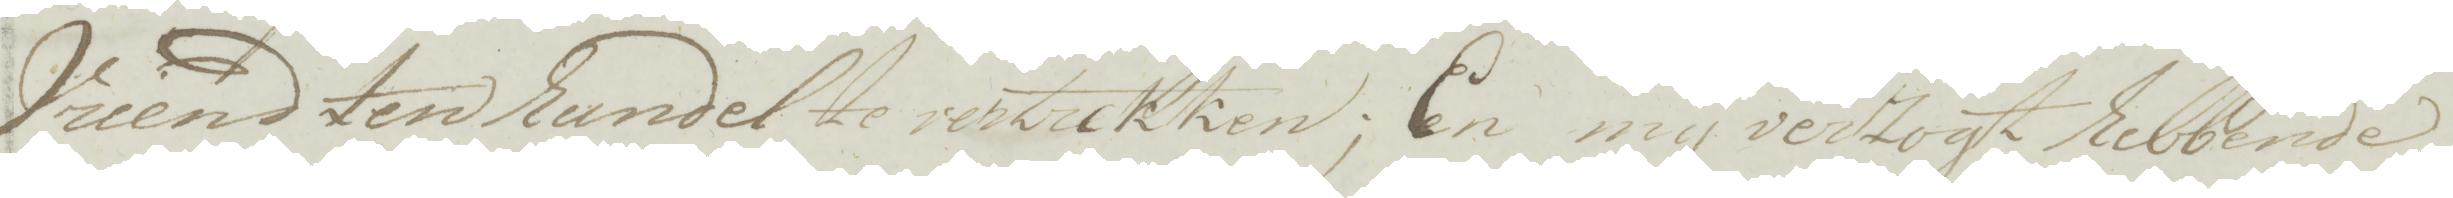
Vriend ten handel te vertrekken; En mij verzogt hebbende
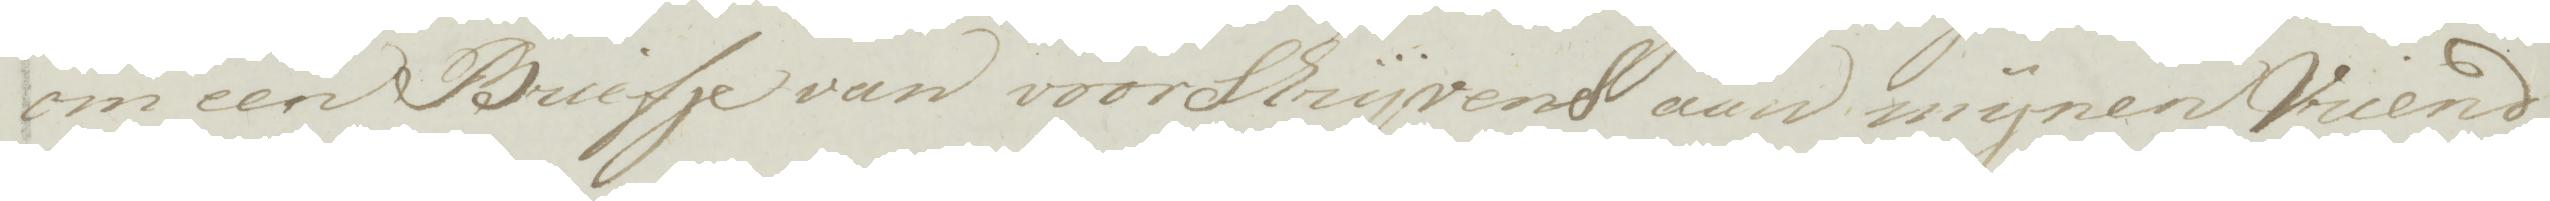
om een Briefje van voor Schrijvens aan mijnen Vriend,
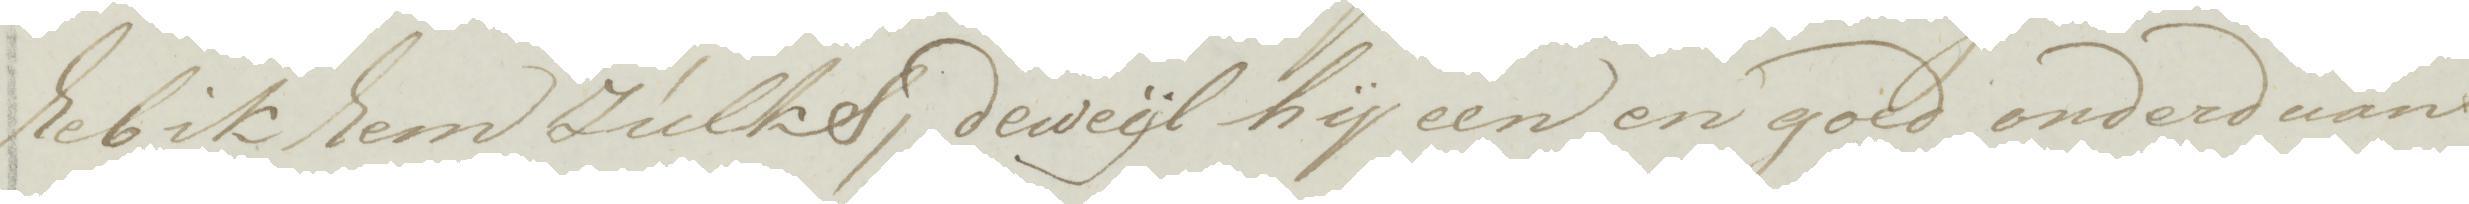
heb ik hem zulks, deweijl hij een en goed onderdaan
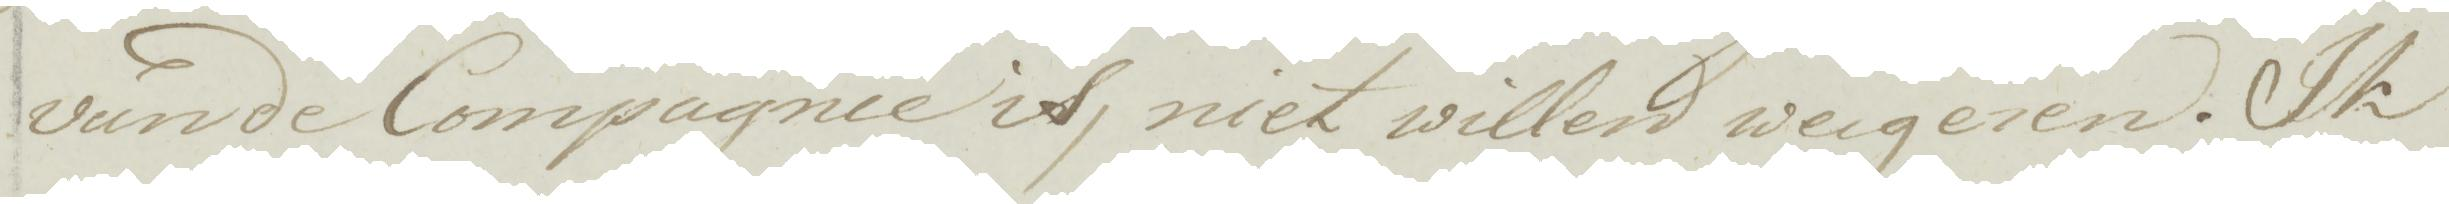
van de Compagnie is, niet willen weigeren. Ik
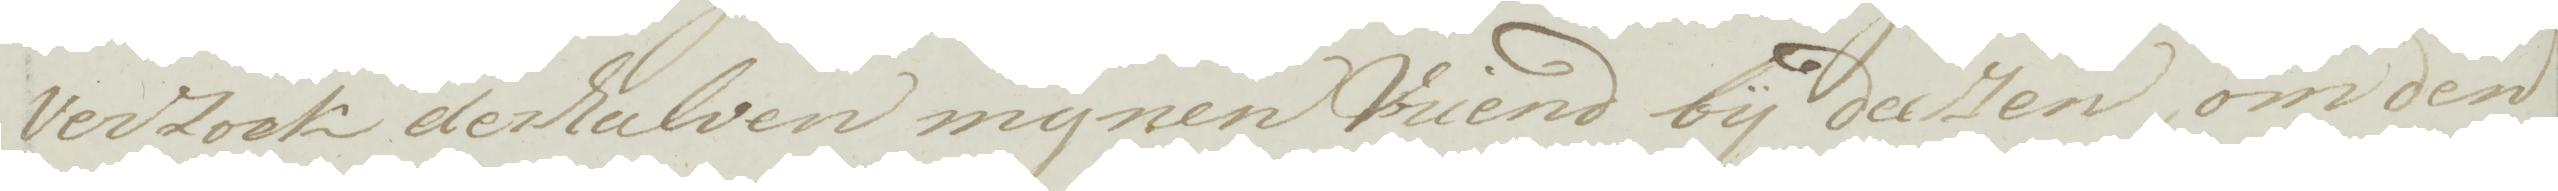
verzoek derhalven mijnen Vriend bij deezen, om den
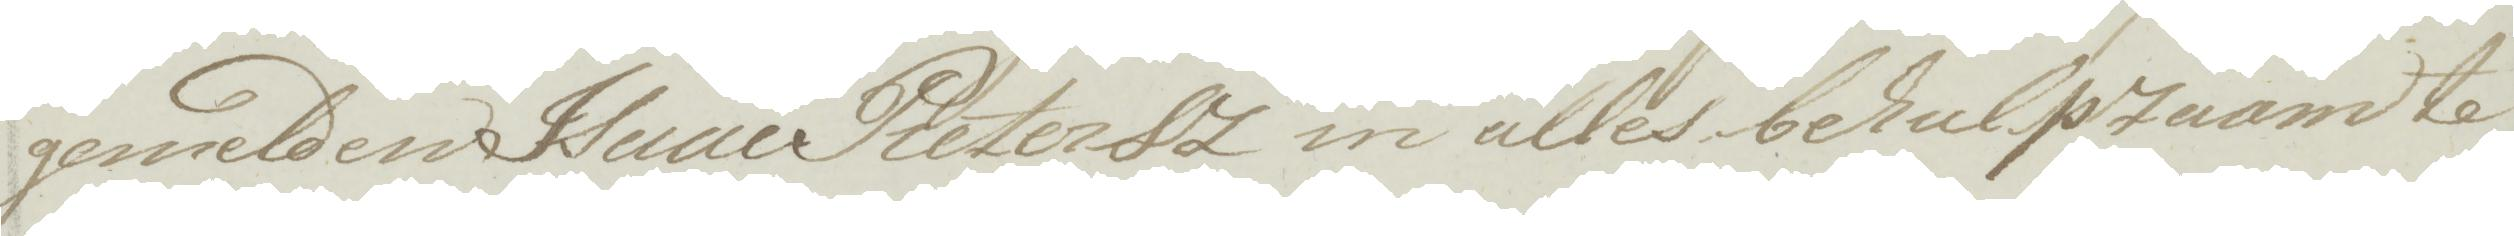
gemelden Isaac Pietersz in alles behulpzaam te
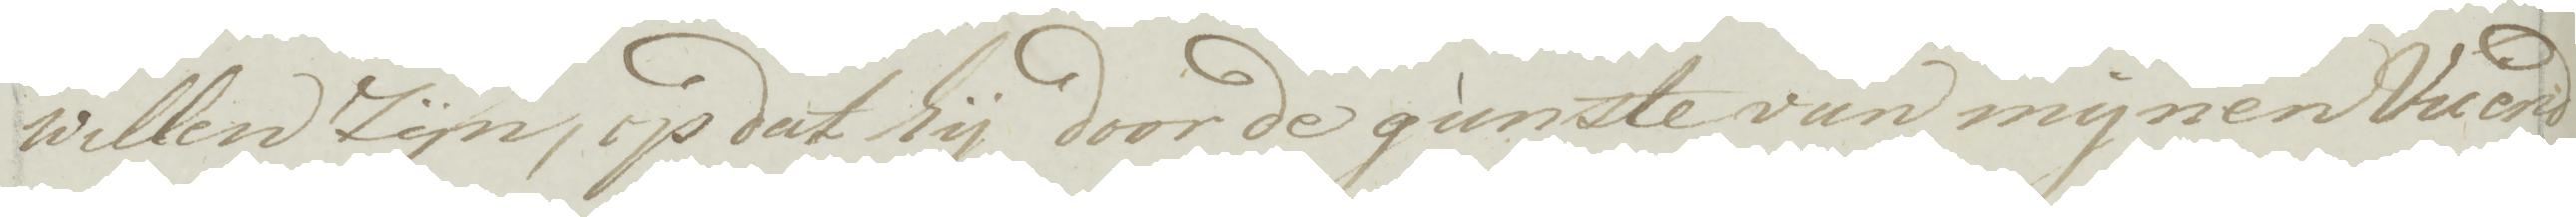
willen Zijn, op dat hij door de gunste van mijnen Vriend
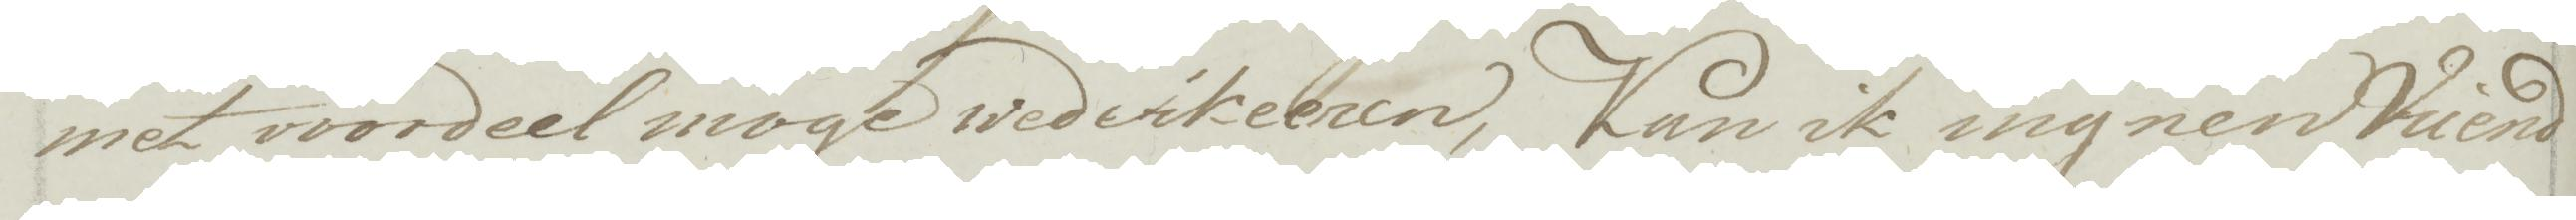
met voordeel moge wederkeeren, Kan ik mijnen Vriend
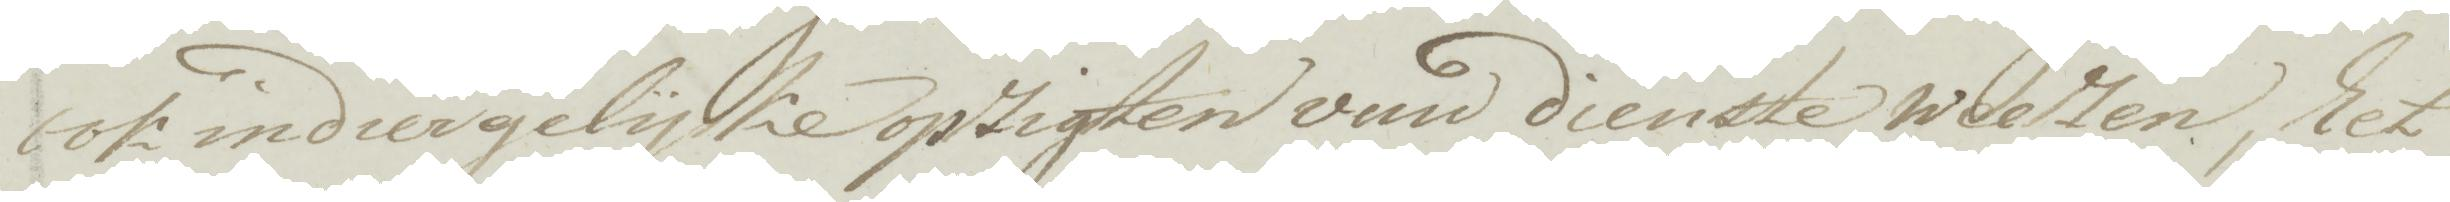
ook in diergelijke opzigten van dienste weezen, het
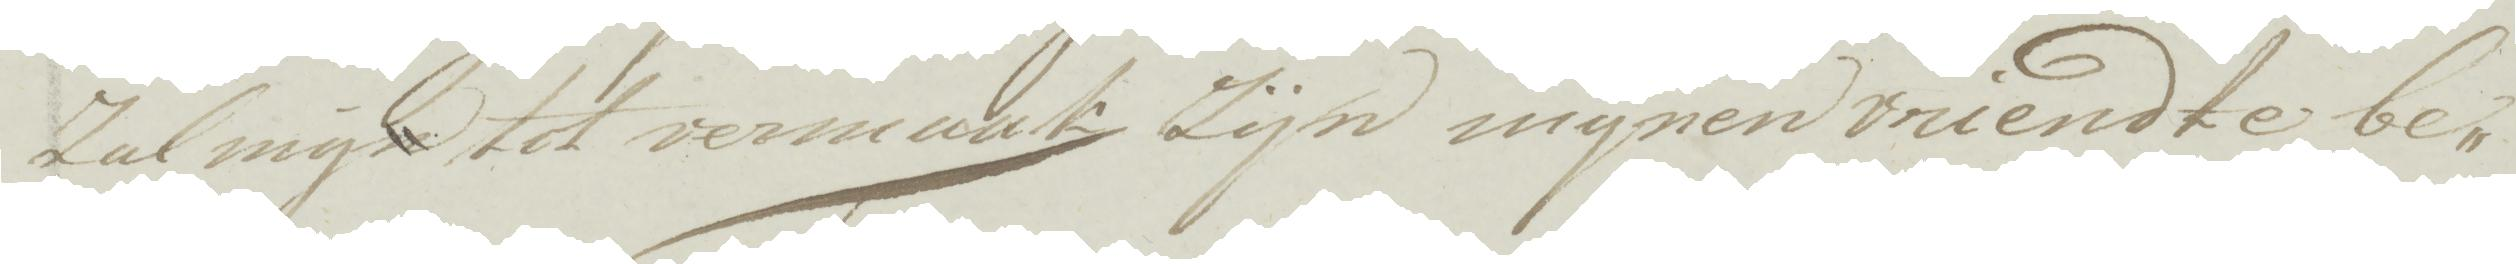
Zal mijn tot vermaak Zijn mijnen vriend te be„
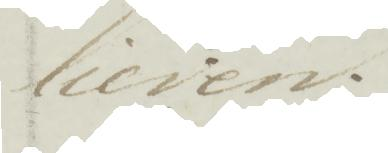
lieven.
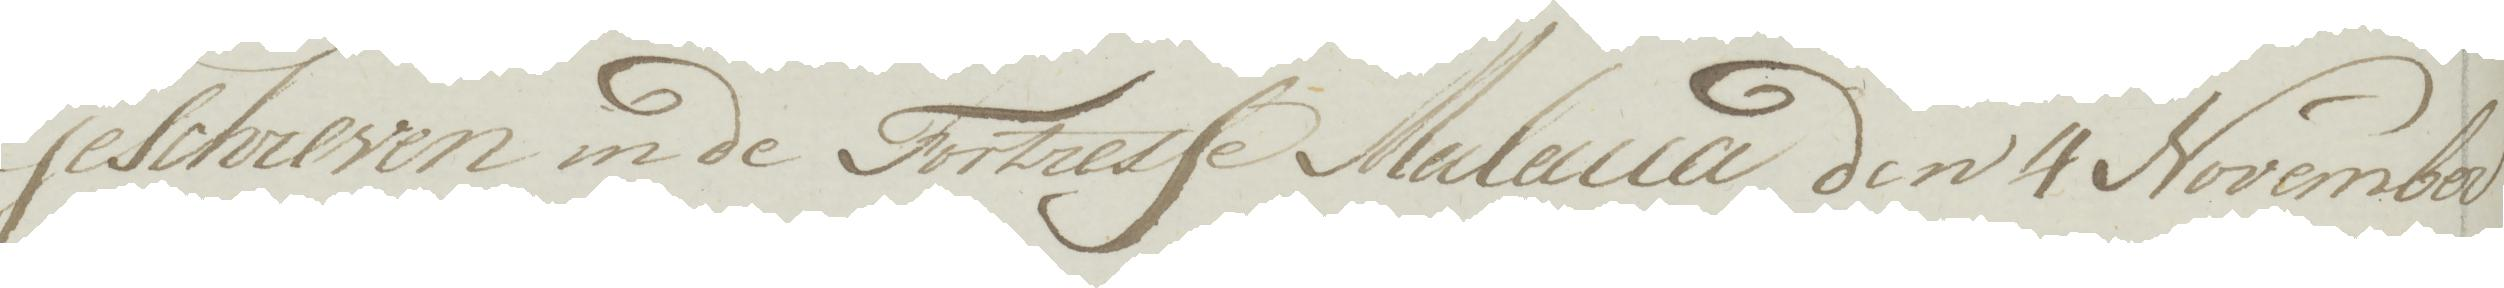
Geschreven in de Fortresse Malacca den 4 November
